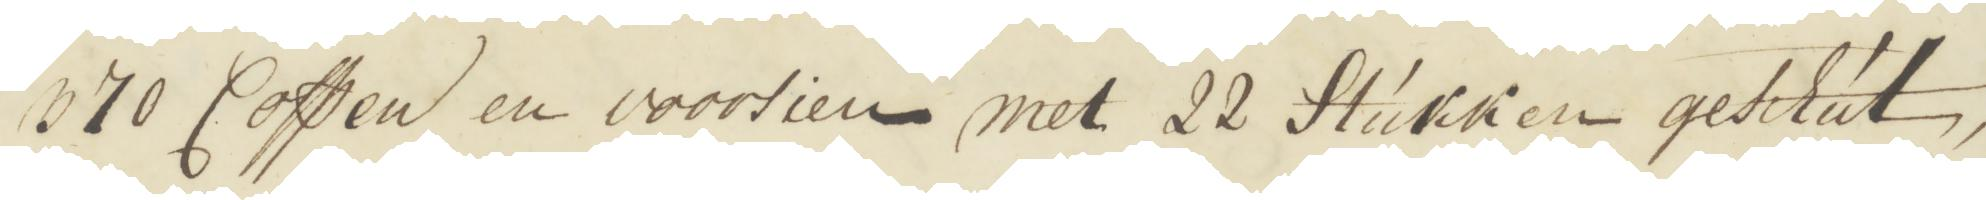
370 Coppen en voorsien met 22 stukken geschut,
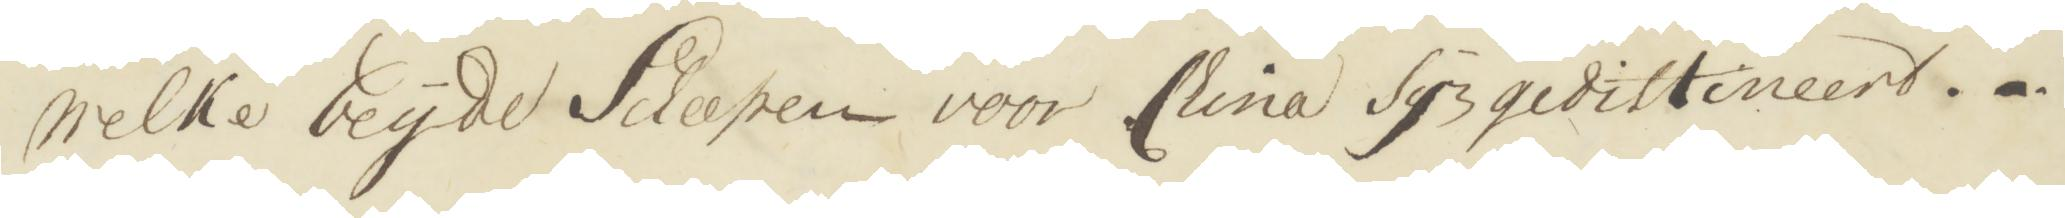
welke beijde scheepen voor China sijn gedistineert. – .
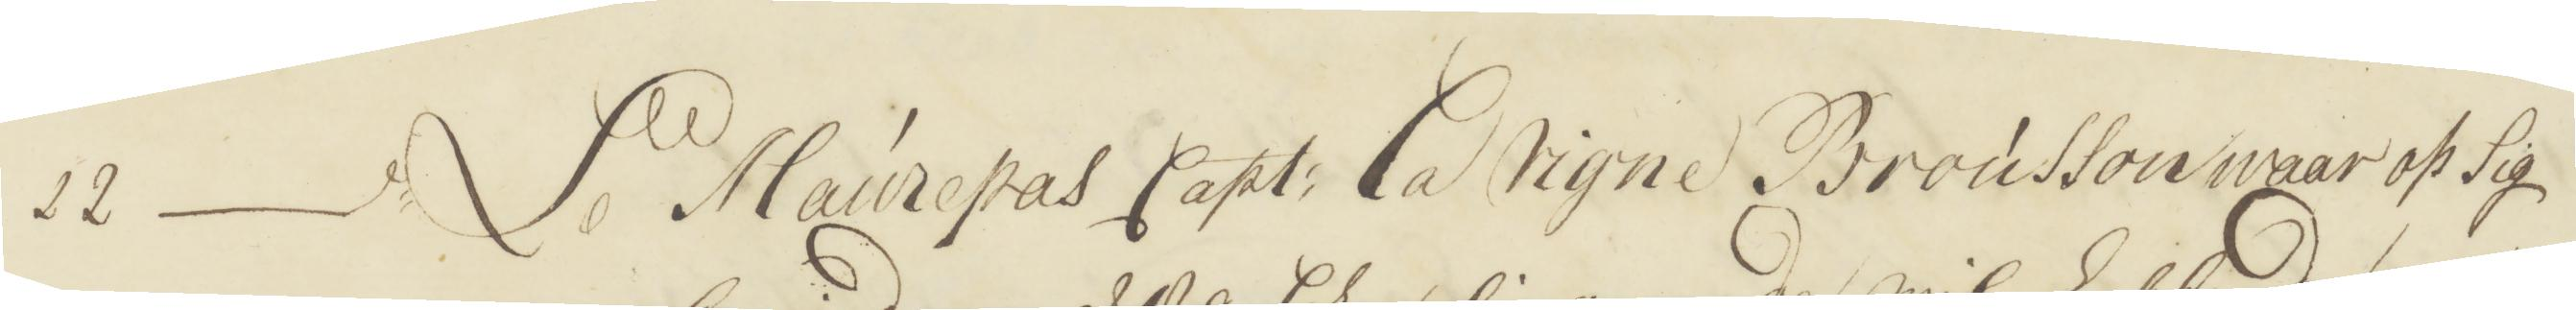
22 _„o Le Maurapas Capt: la rigne Brousson waar op sig
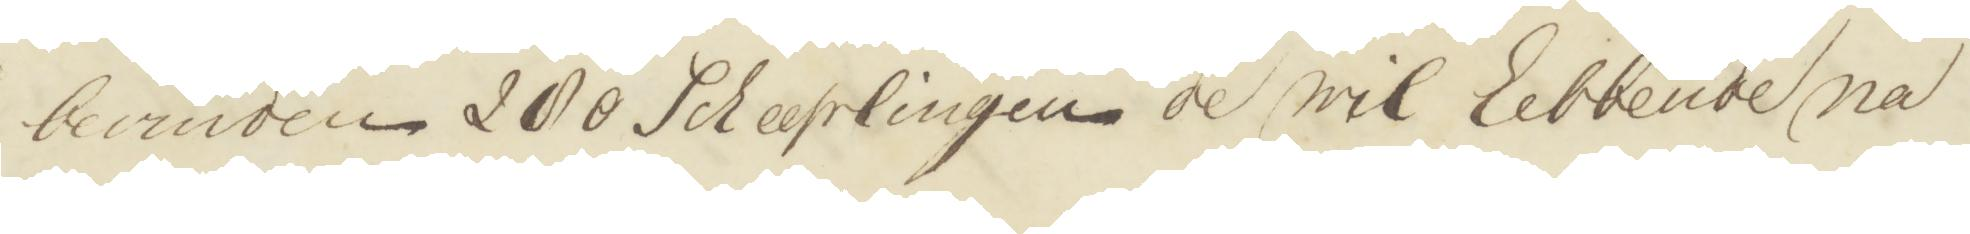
bevinden 280 scheeplingen de wil hebbende na
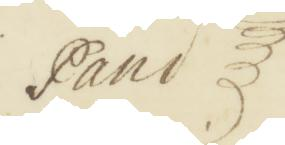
Pand
